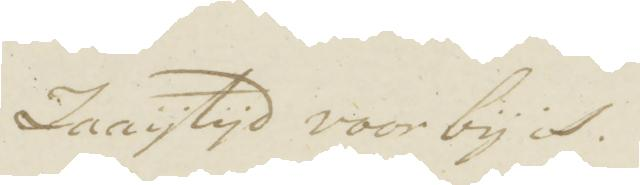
Zaaijtijd voor bij is.
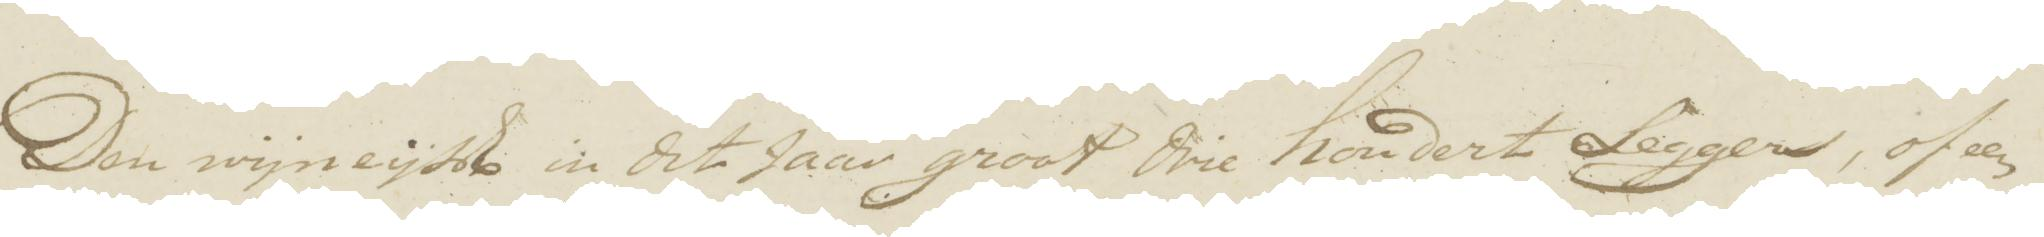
Den wijn eijsch in dit jaar groot drie hondert Leggers, of een
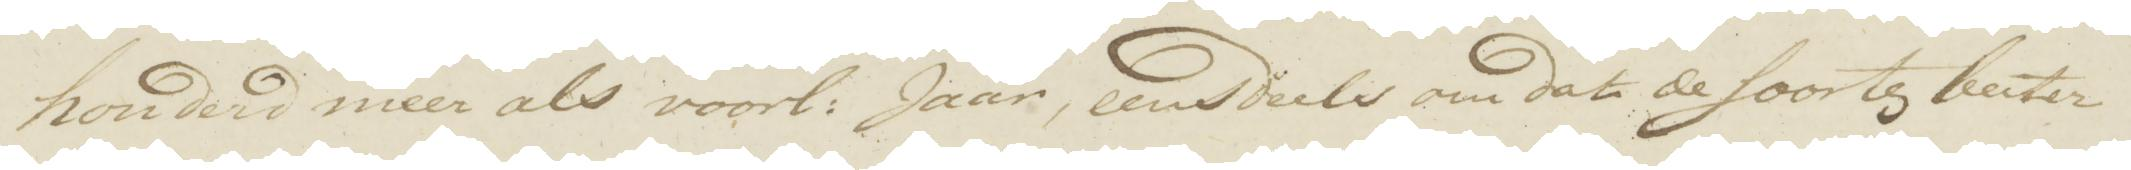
honderd meer als voorl: jaar, eensdeels om dat de soorten beeter
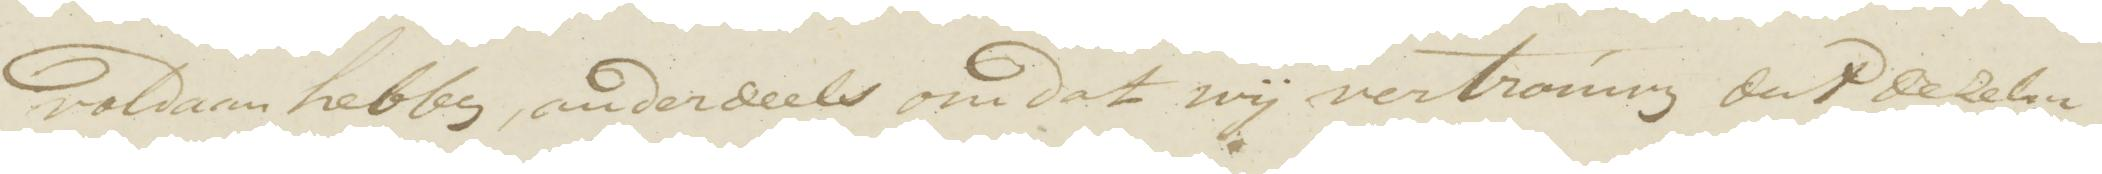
voldaan hebben, anderdeels om dat wij vertrouwen dat dezelven
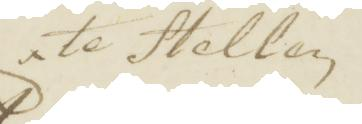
^ te stellen,
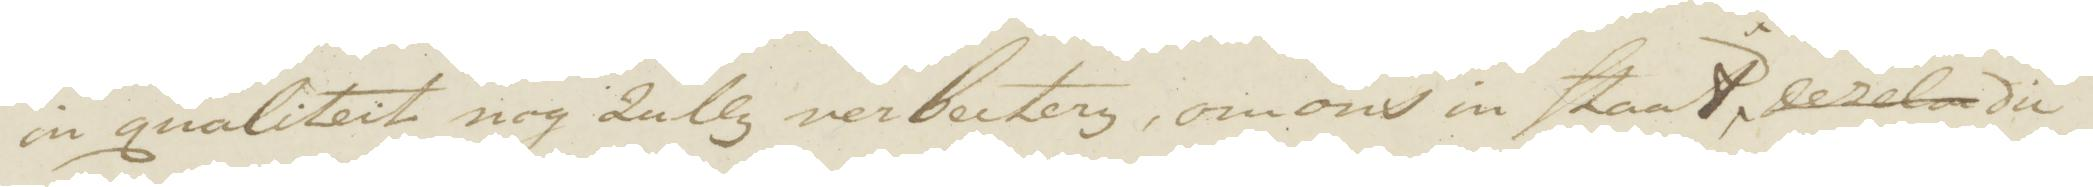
in qualiteit nog zullen verbeeteren, om ons in staat ^ dezelve die
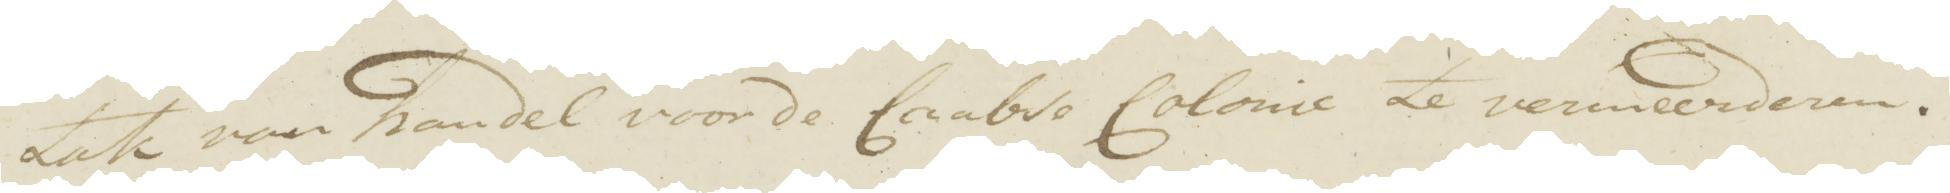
tak van handel voor de Caabse Colonie te vermeerderen.
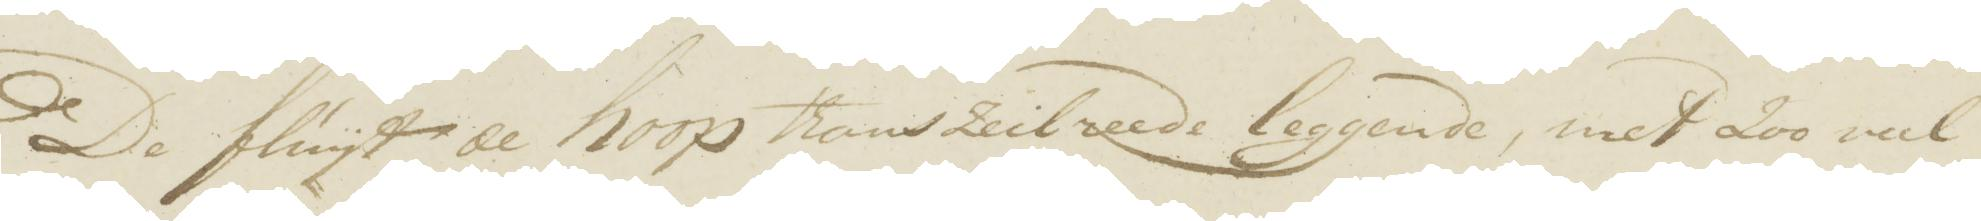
De fluijt de hoop thans zeil reede leggende, met zoo veel
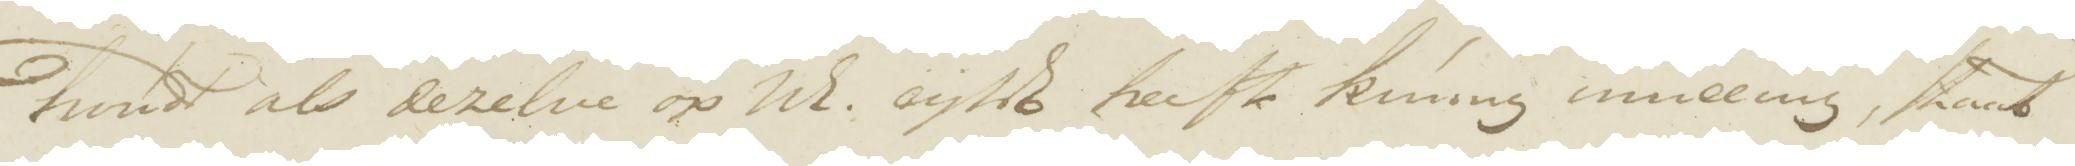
houdt als dezelve op UE. eijsch heeft kunnen inneemen, staat
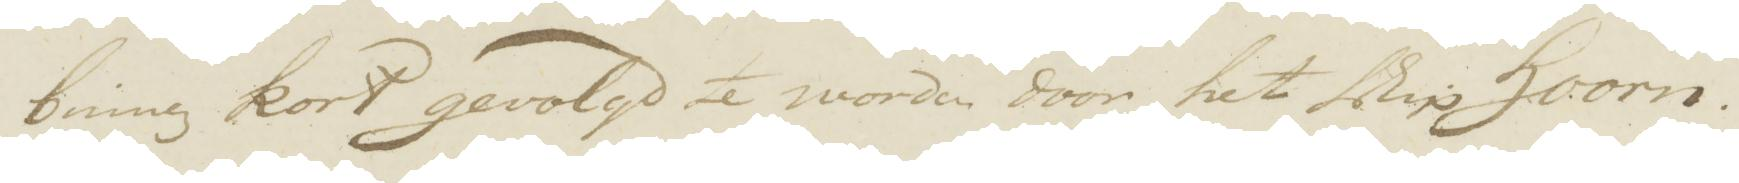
binnen kort gevolgd te worden door het schip Hoorn.
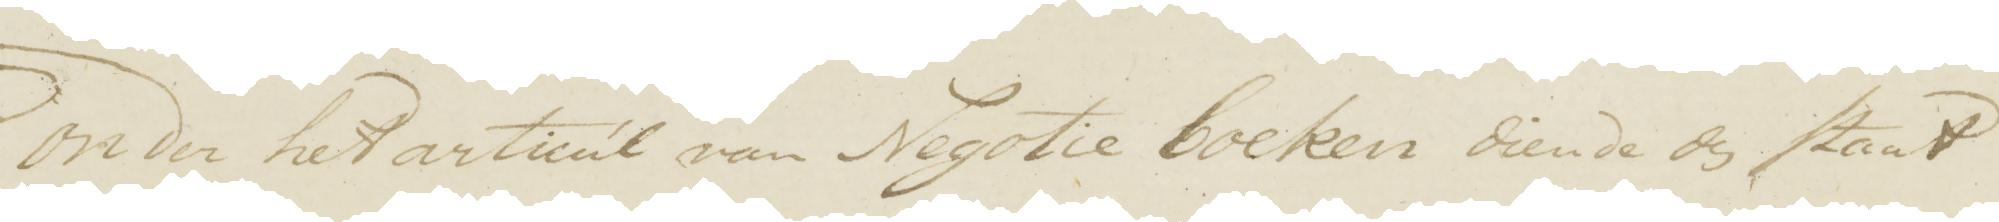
onder het articul van Negotie boeken diende den staat
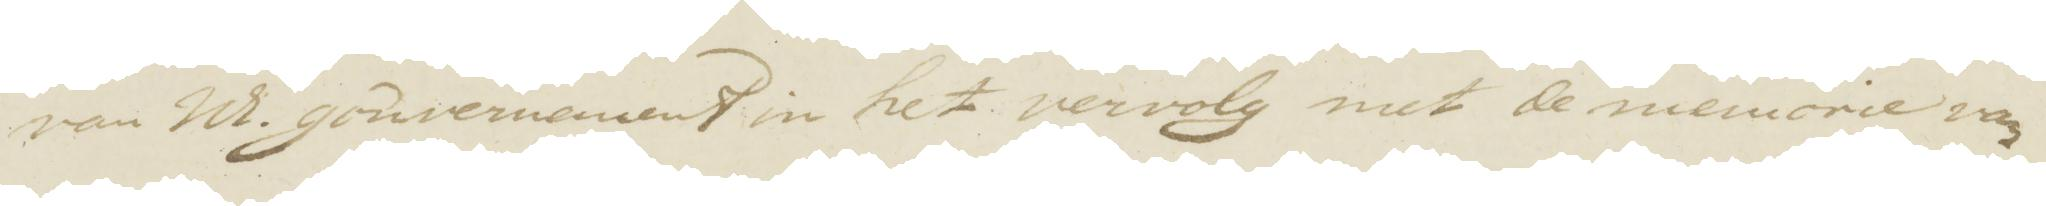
van UE. gouvernement in het vervolg met de memorie van
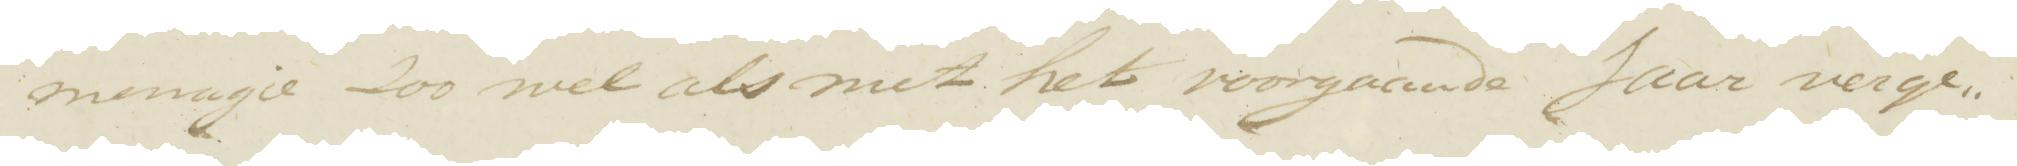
menagie zoo wel als met het voorgaande jaar verge„
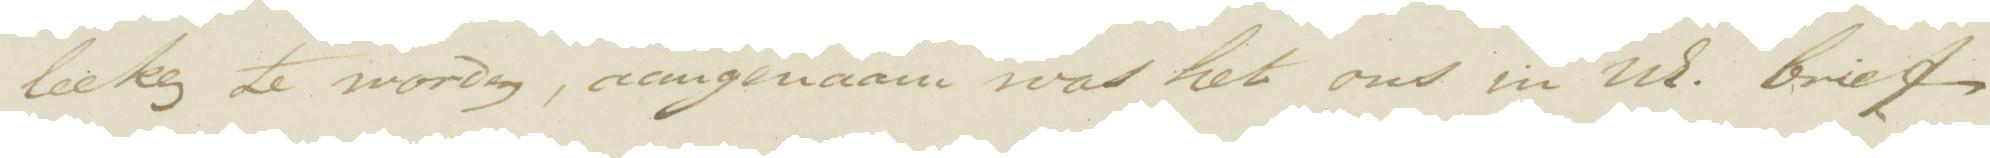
leeken te worden, aangenaam was het ons in UE. brief
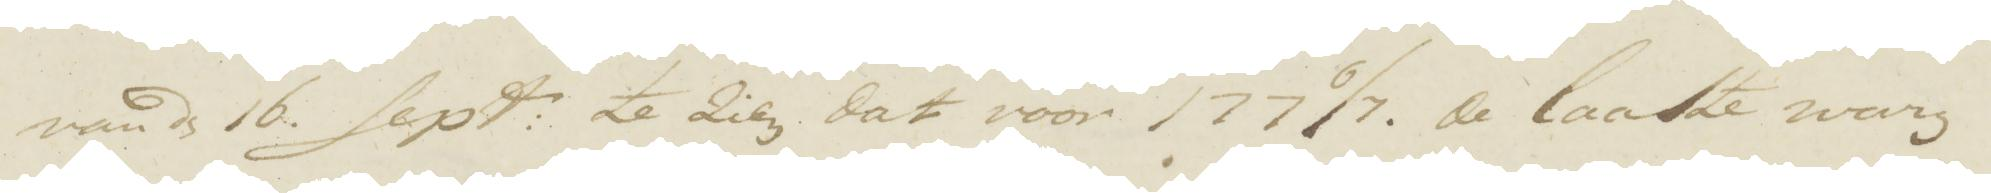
van den 16. Sept: te zien dat voor 177 6/7. de laaste waren
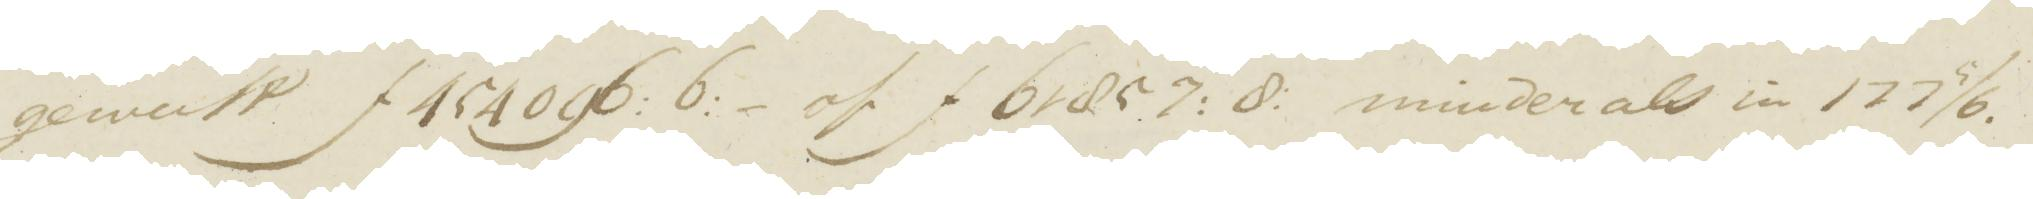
geweest ƒ454096: 6: - of ƒ 61857: 8: minder als in 177 5/6.
